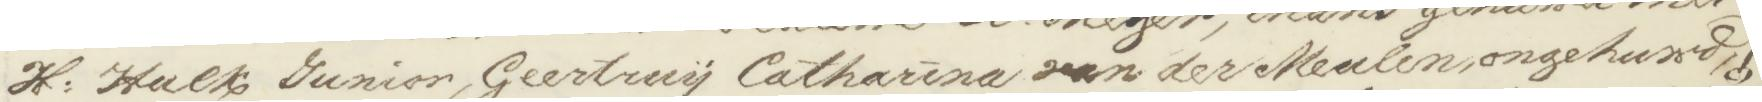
H: Hulk Iunior, Geertruij Catharina van der Meulen, ongehuwd,
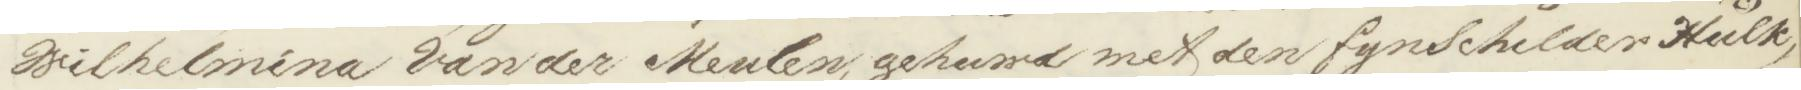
Wilhelmina van der Meulen, gehuwd met den fynschilder Hulk
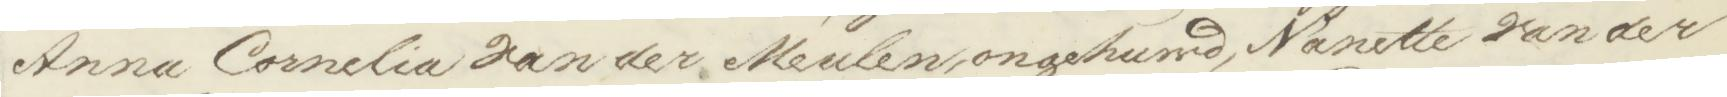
Anna Cornelia van der Meulen, ongehuwd, Nanette van der
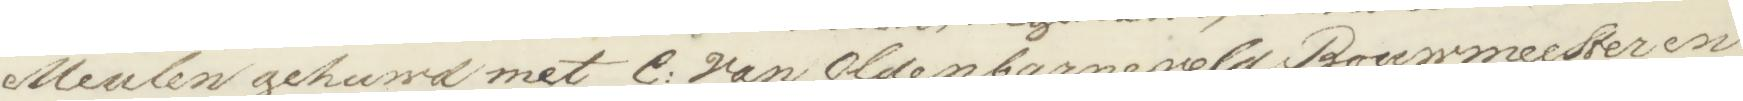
Meulen gehuwd met E: van Oldenbarneveld Bouwmeester en
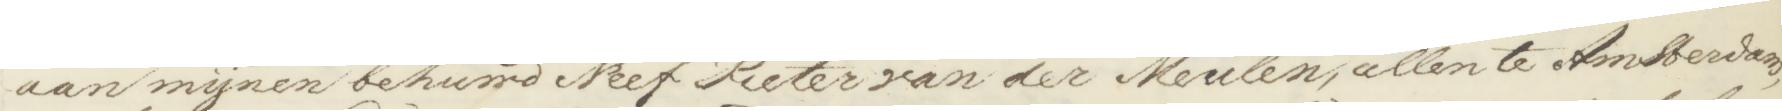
aan mijnen behuwd Neef Pieter van der Meulen, allen te Amsterdam
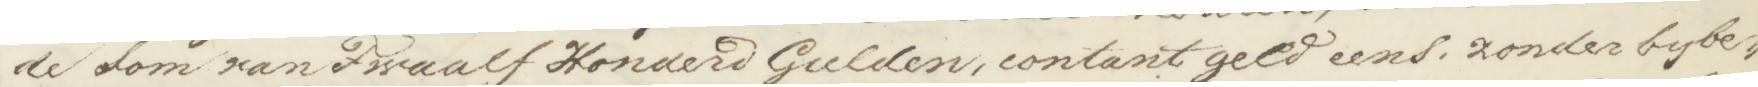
de som van Twaalf Honderd Gulden, contant geld eens, zonder bybe
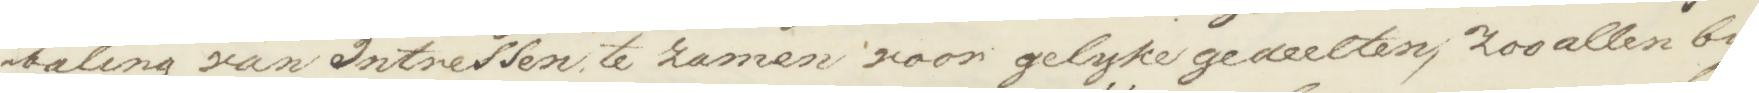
taling van Intressen, te zamen voor gelyke gedeelten, zoo allen bij
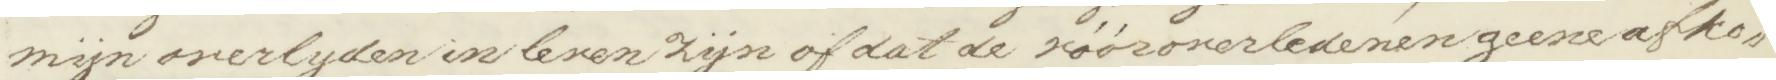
mijn overlyden in leven zijn of dat de vóóroverledenen geene afko„
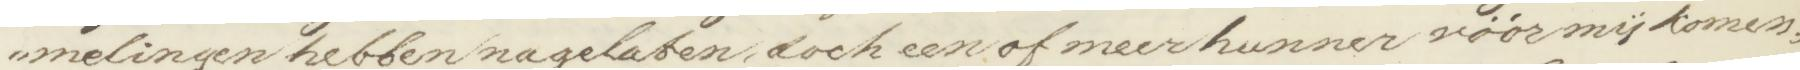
„melingen hebben nagelaten, doch een of meer hunner voor mij komen
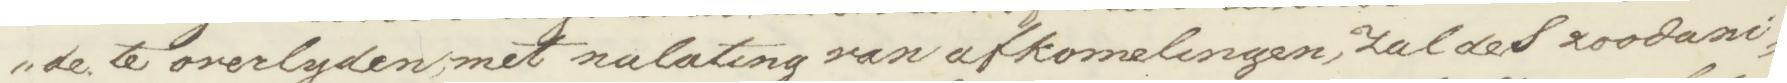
„de te overlyden met nalating van afkomelingen, zal des zoodani„
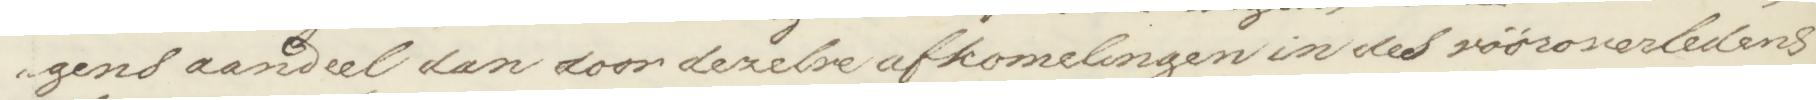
„gens aandeel dan door dezelve afkomelingen in des vóóroverledens
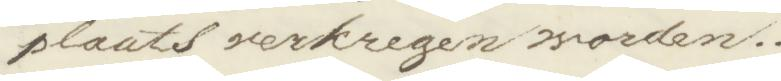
plaats verkregen worden.
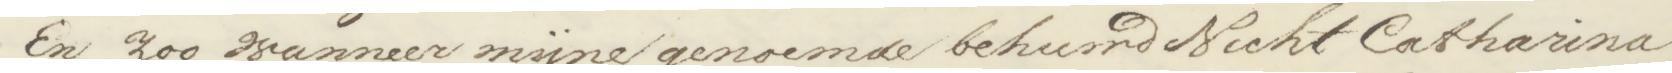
En zoo Wanneer mijne genoemde behuwd Nicht Catharina
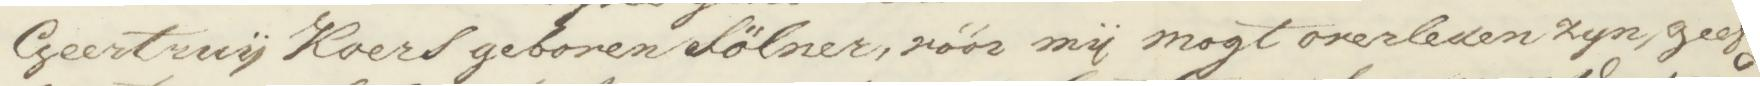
Geertruij Koers geboren Sölner, voor mij mogt overleden zyn, geef
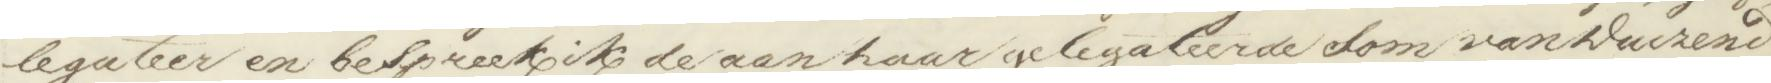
legateer en bespreek ik de aan haar gelegateerde som van Duizend
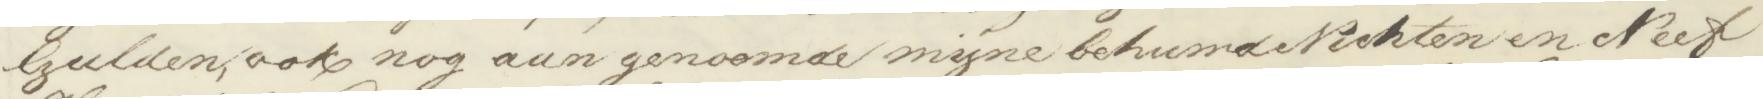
Gulden ook nog aan genoemde mijne behuwde Nichten en Neef
